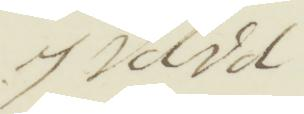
J VdVel
